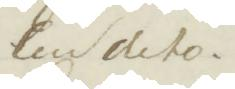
Een dito. . . . . . . . .
